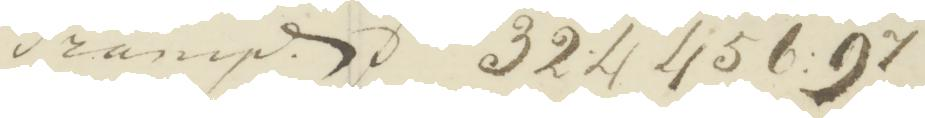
Transp. ƒ 324456: 975
